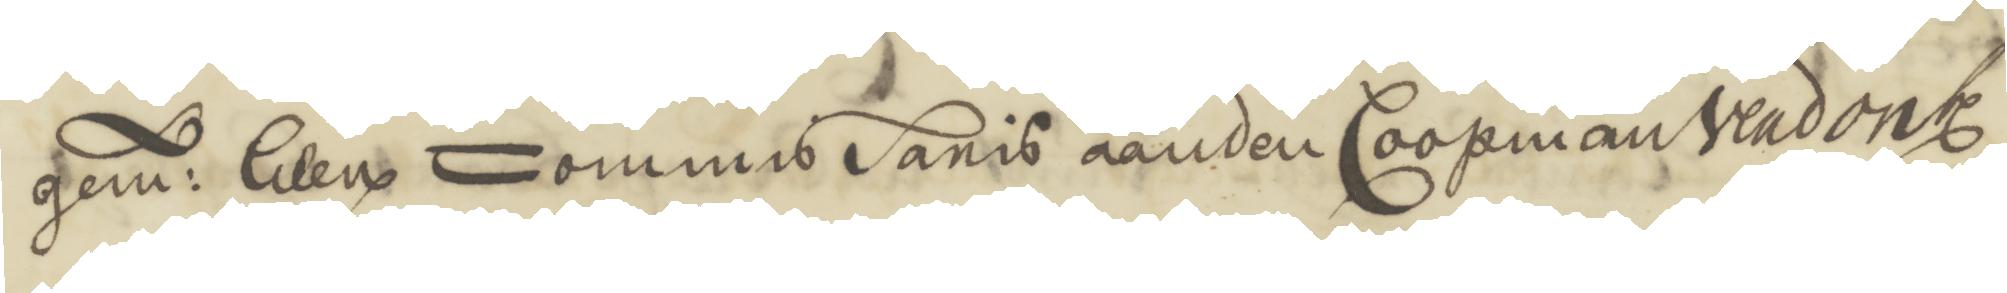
gem:te heer Commissaris aan den Coopman Verdonk
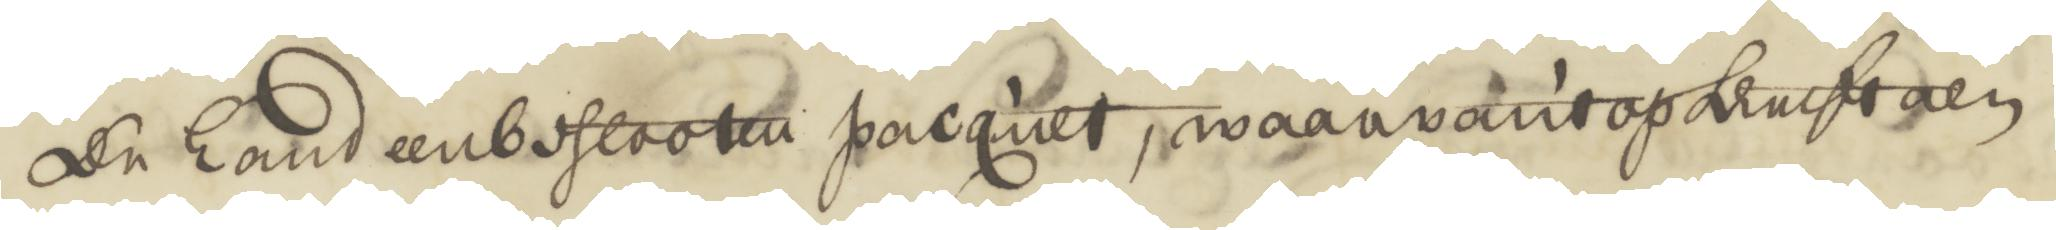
ter hand een beslooten pacquet, waarvan ’t op schrift aen
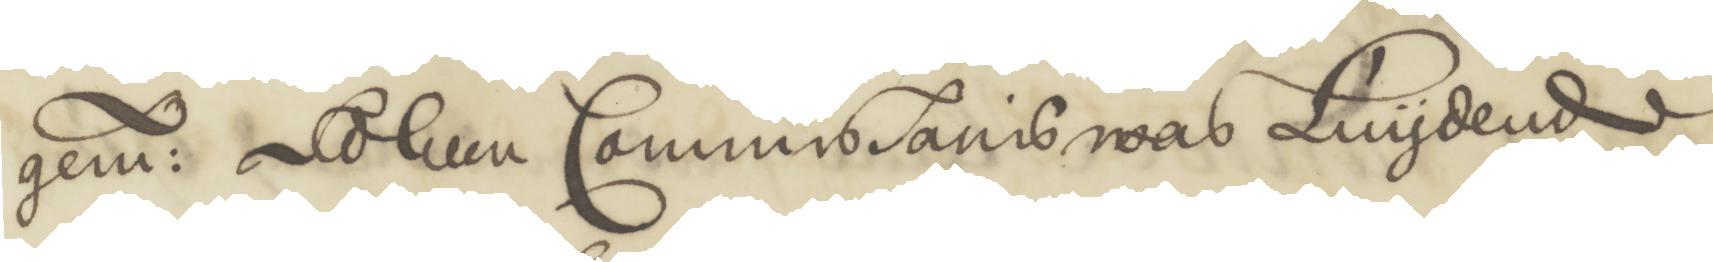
gem: Ed heer Commissaris was Luijdende
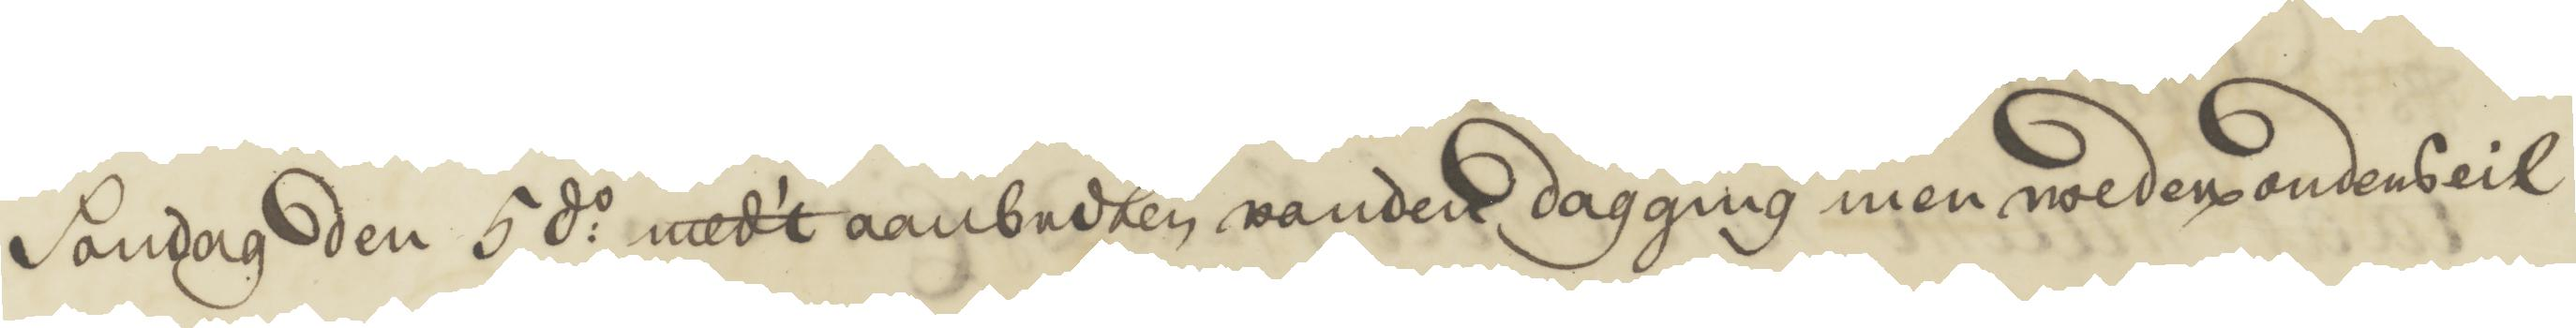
Sondag den 5 d:o med't aanbreken van den dag ging men weder onder seil
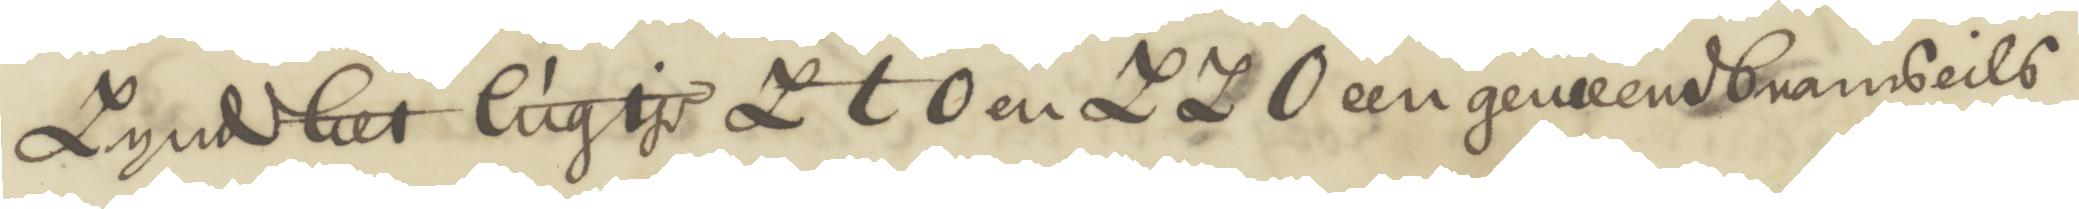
Zynde het lugtje Z T O en Z Z O een gemeene bramseils
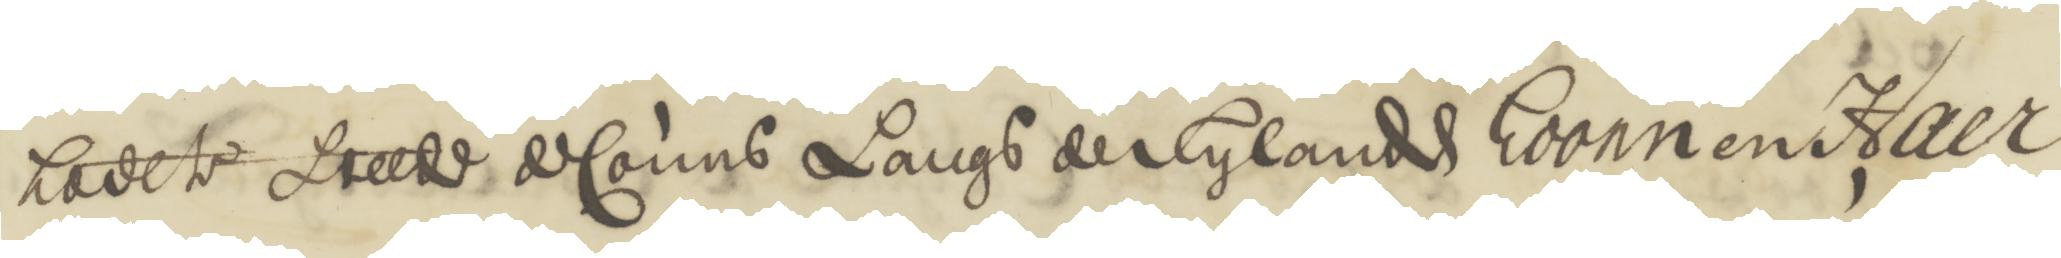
koelte steede de Cours Langs de Eylanden hoornen Haer
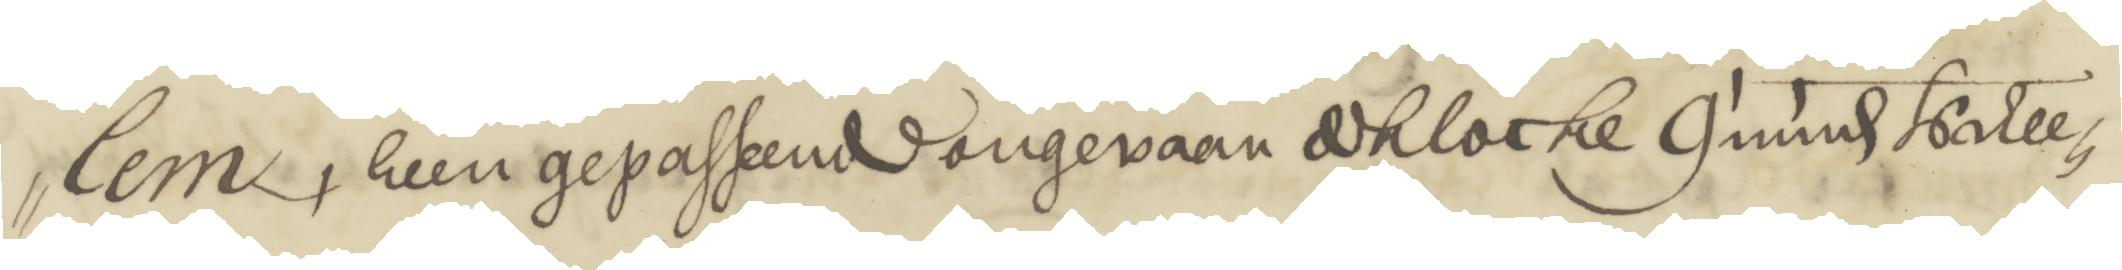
„lem, heen gepasseerde ongevaar de klocke 9 uuren ´tschee„
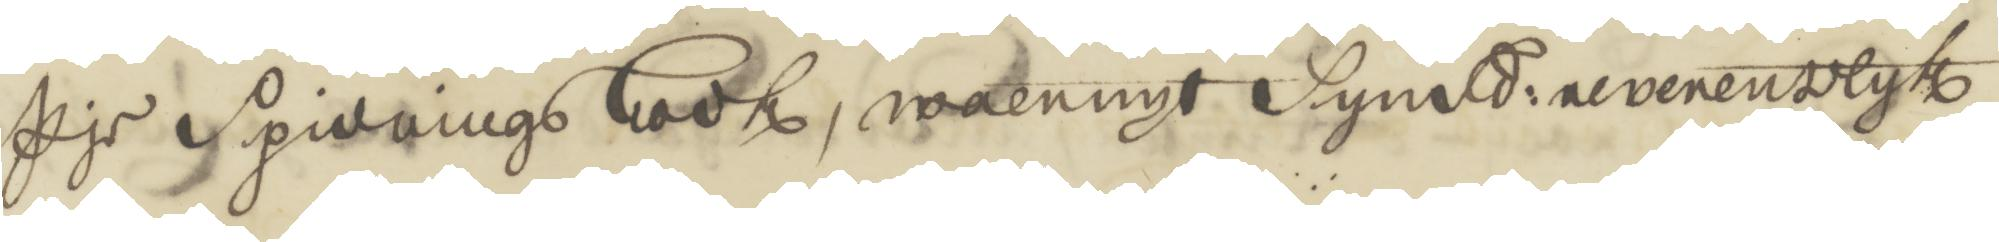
pje Spieringshoek, waeruyt Syn Ed: reverentelyk
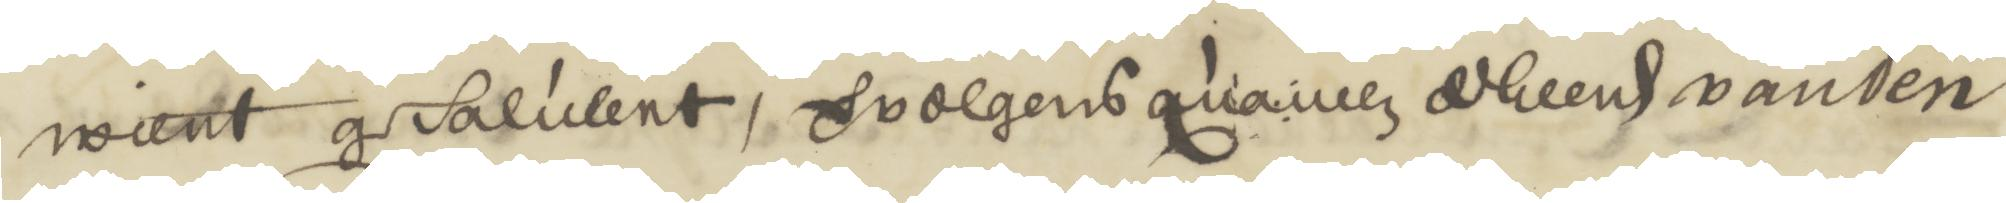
wiert gesalulert, vervolgens quamen de heeren van den
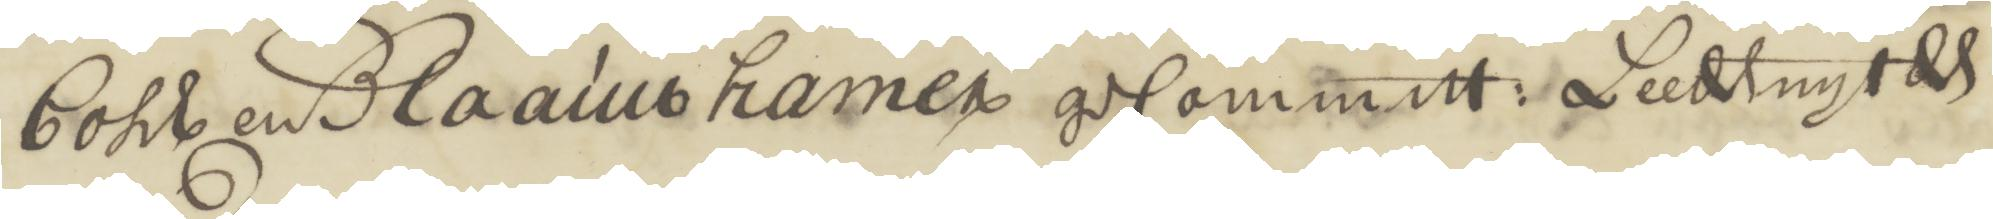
bosch en Blaauwhamer gecommitt: Leeden uyt den
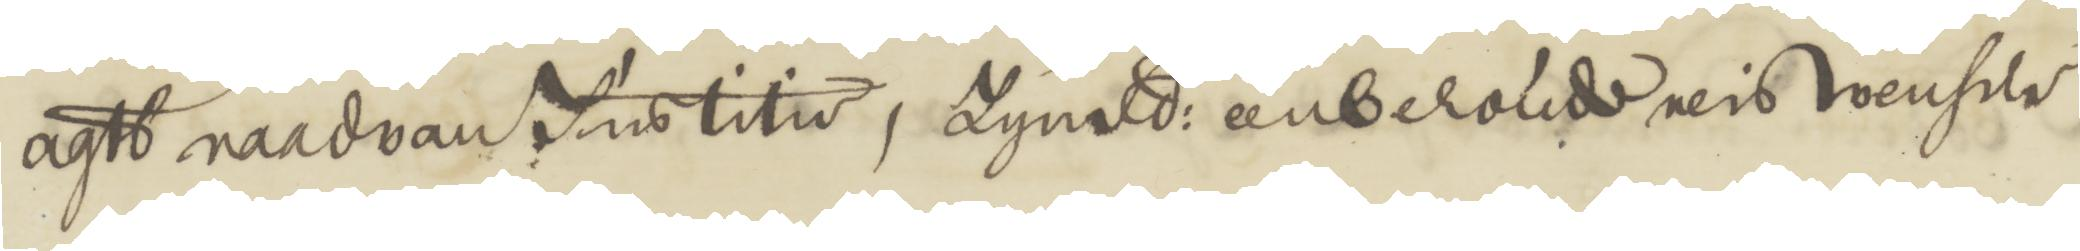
agtb raad van Iustitie, Zyn Ed: een behoude reis wensche
